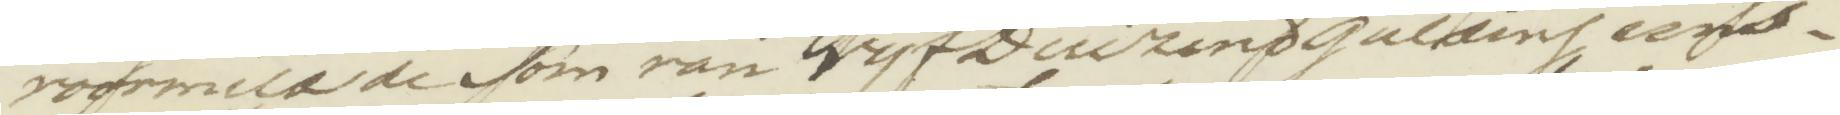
voormeld de som van Vyf Duizend guldens eens-
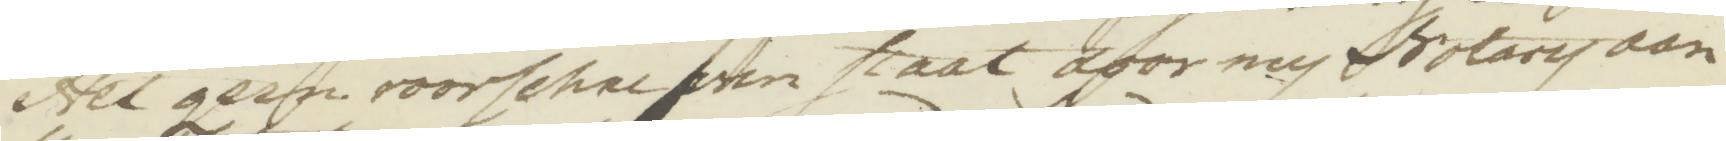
Het geen voorschreven staat door my Notaris aan
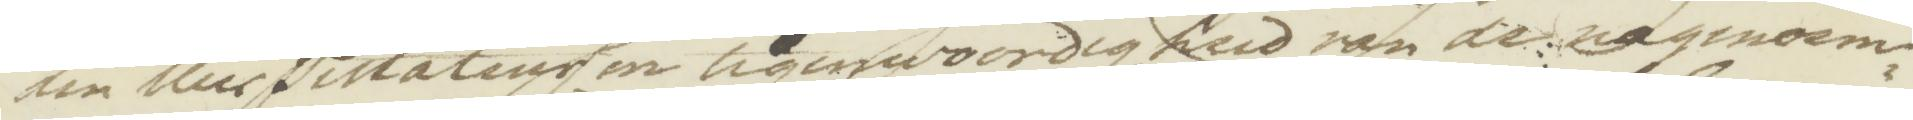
den Heer Testateur in tegenwoordigheid van de nagenoem„
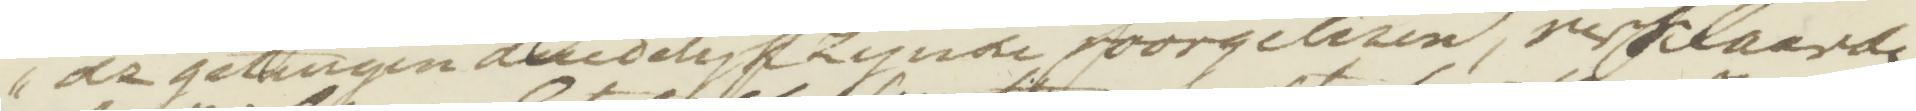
„ de getuigen duidelyk zynde voorgelezen, verklaarde
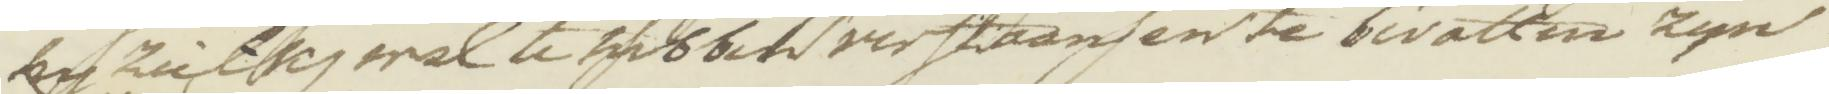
hy zulks wel te hebben verstaan, en te bevatten zyn
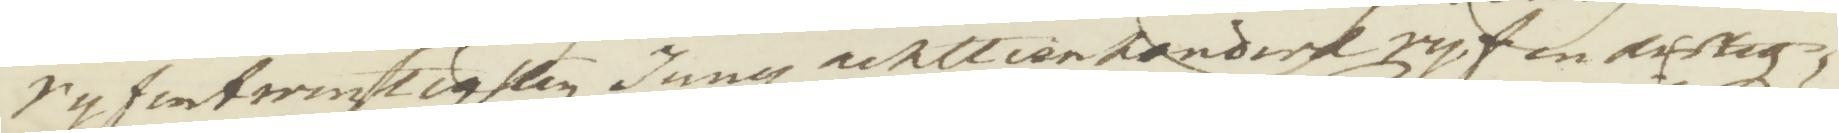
vyfentwintigsten Iuny achttien honderd vyf en zestig,
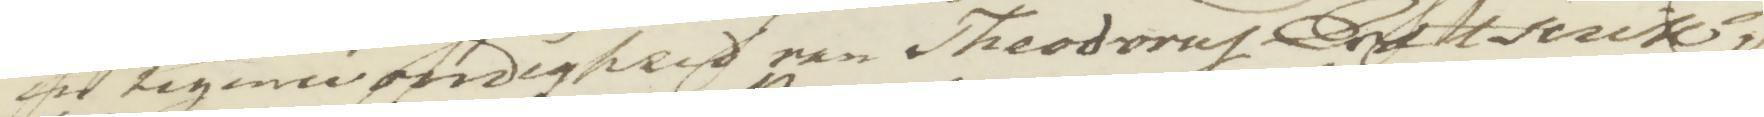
in tegenwoordigheid van Theodorus Erdtsieck,
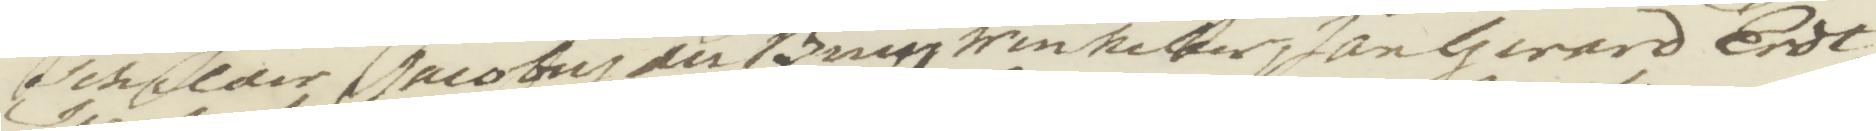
schilder Jacobus du Buy, winkelier, Jan Gerard Erdt
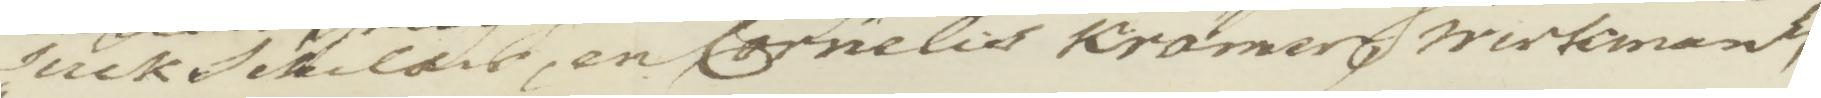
sieck schilder, en Cornelis Kramer, werkman,
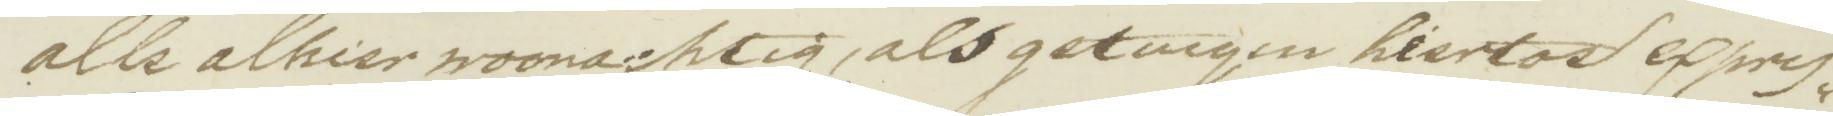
alle alhier woonachtig, als getuigen hiertoe expres„
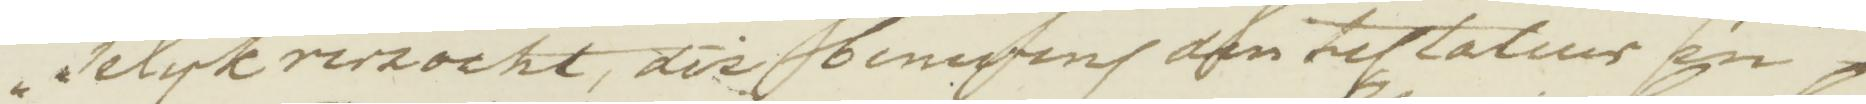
„selyk verzocht, die benevens den testateur en
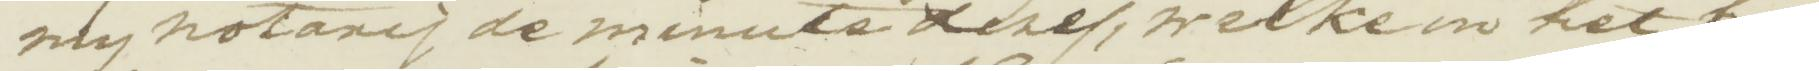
my notaris de minute dezes, welke in het be
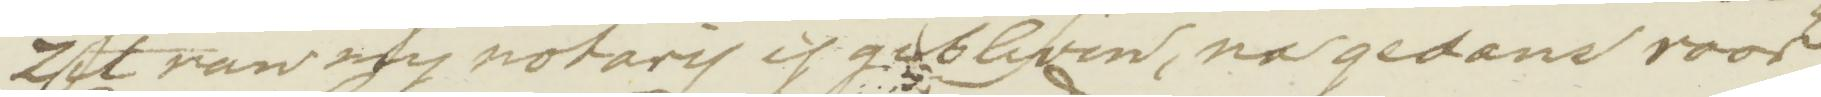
zit van my notaris is gebleven, na gedane voor
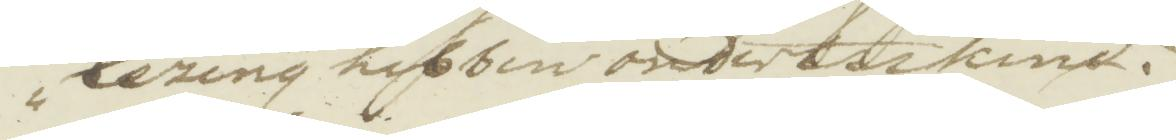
„lezing hebben ondertekend.
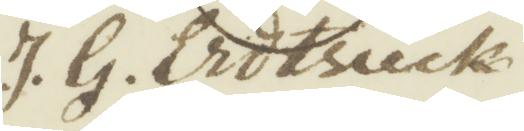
J. G. Erdsieck
